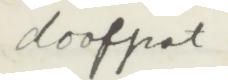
doofpot
